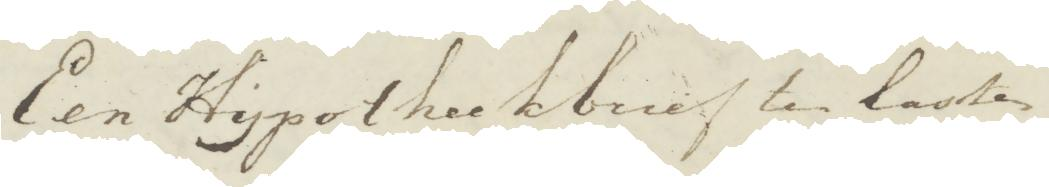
Een Hijpotheekbrief ten lasten
